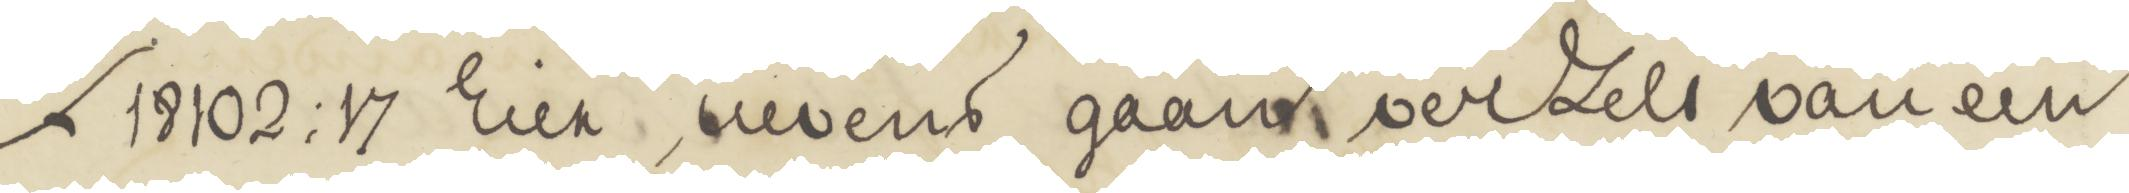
ƒ18102:17 hier nevens gaan verzelt van een
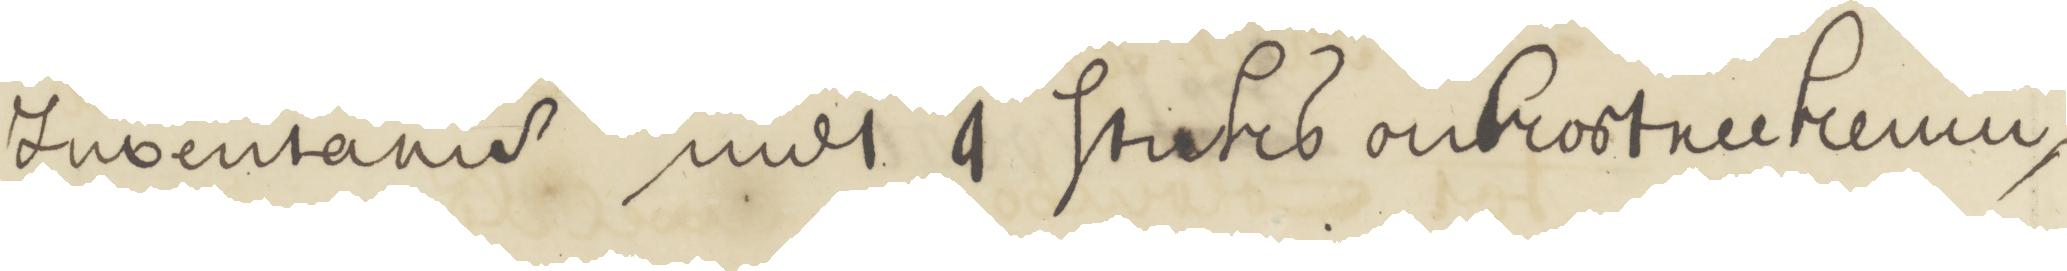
Inventaris met 4 stuks onkostreekenin
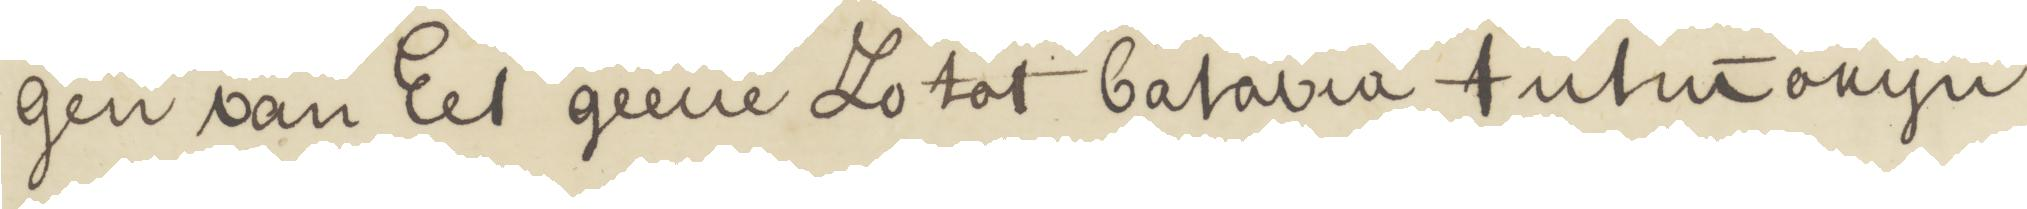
gen van het geene zo tot batavia tutucorijn
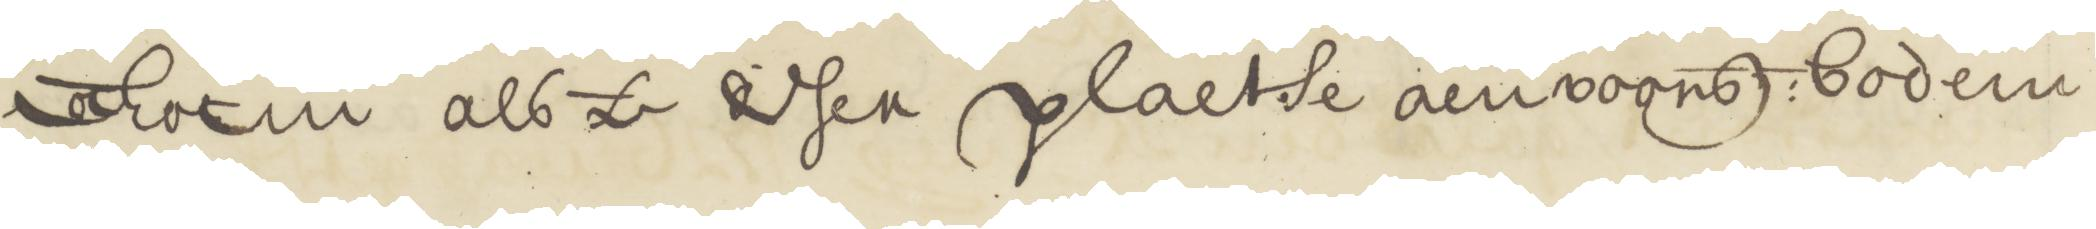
Cochim als te deser plaetse aen voors: bodem
